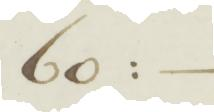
60: —
